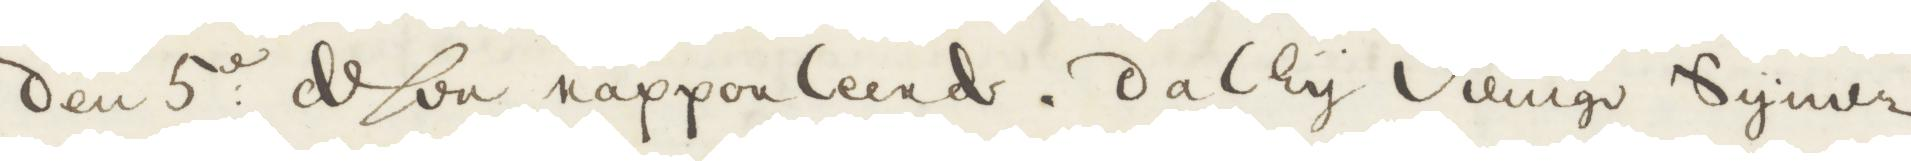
den 5:e deser rapporteerde, dat hij Eenige sijner
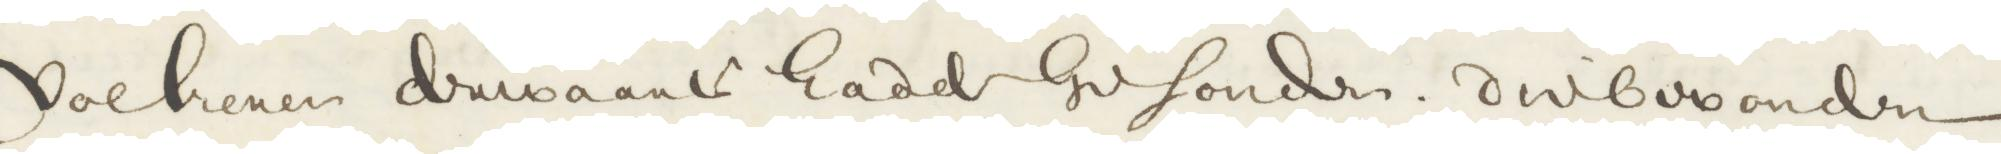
Volkeren derwaarts hadde Gesonden, die bevonden
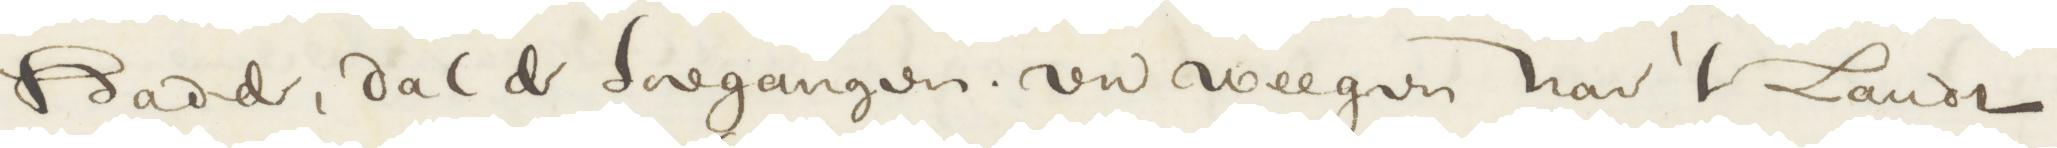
Hadde, dat de toegangen, en weegen nae 't Landt
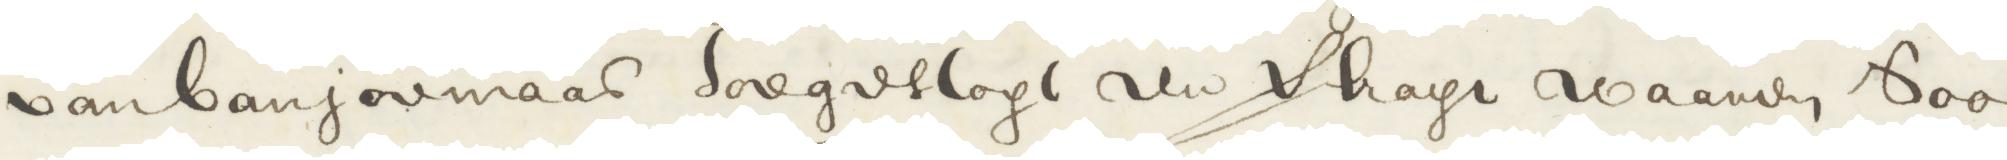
van banjoemaas toegestopt en verkapt waaren soo
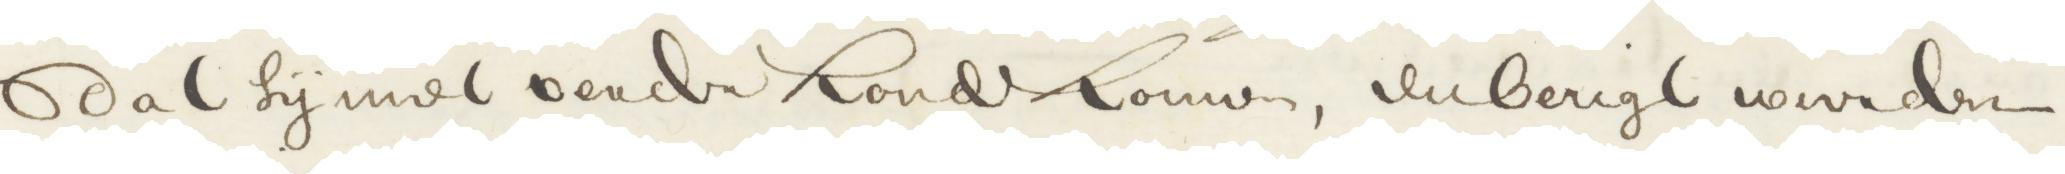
dat sij niet verder konde komen, en berigt wierden
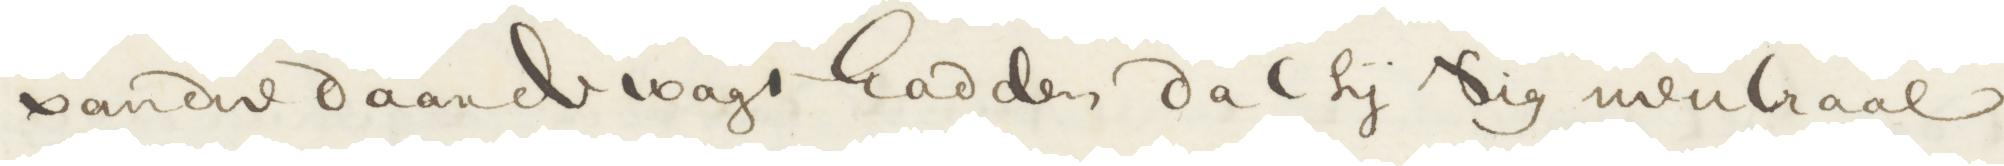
van die daar de wagt hadden dat sij sig neutraal
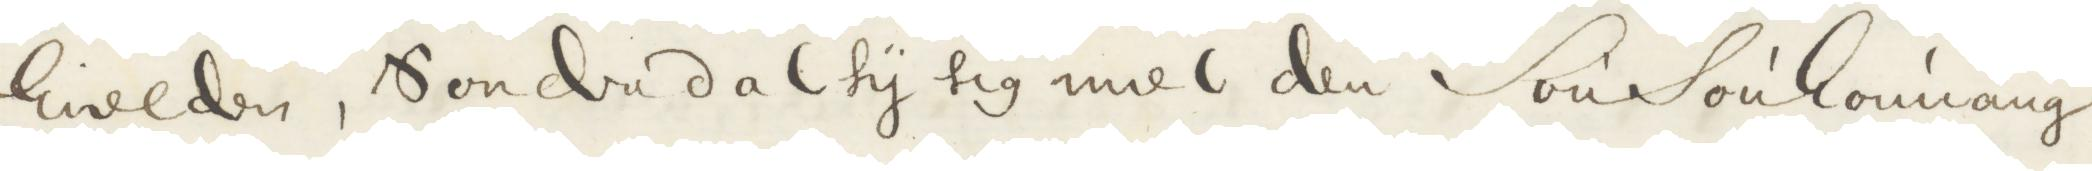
hielden, sonder dat sij sig met den sousouhounang
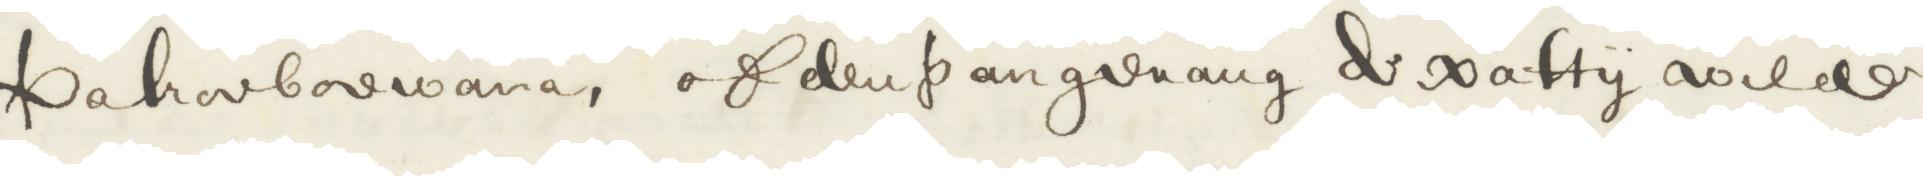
Pakoeboewana, of den pangerang de pattij wilde
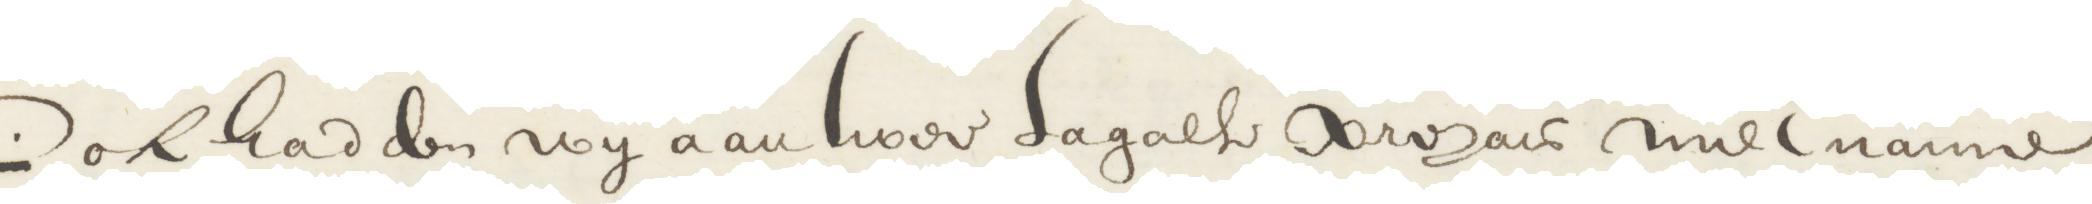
Ook hadden wij aan twee tagalse prejais met name
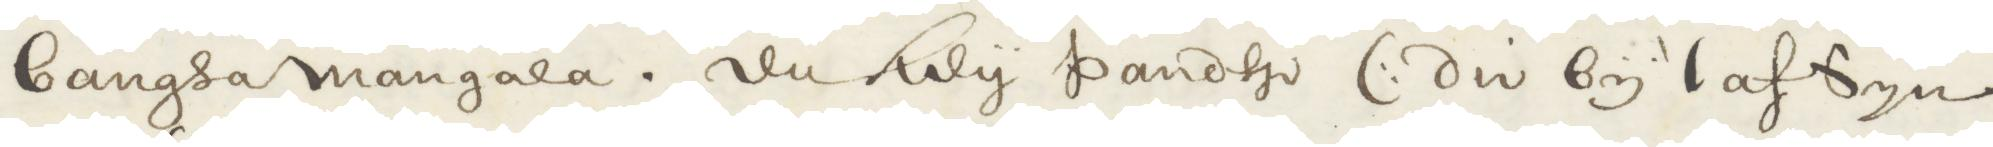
bangsa mangala, en keij pandsje (: die bij ’t af sijn
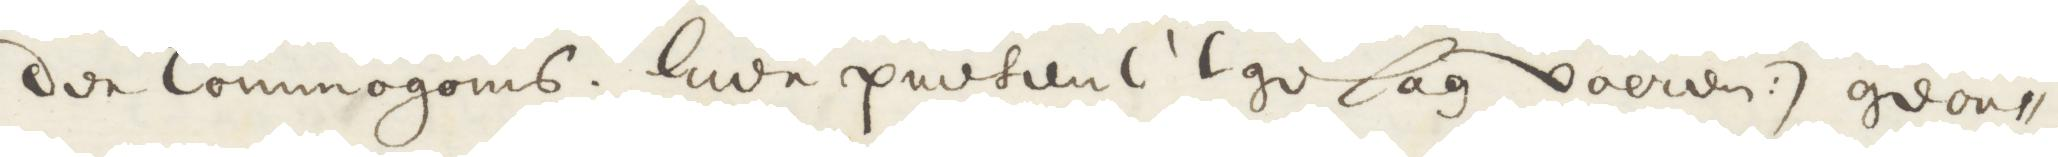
der Commogoms, hier present 't gesag voeren:) geor„
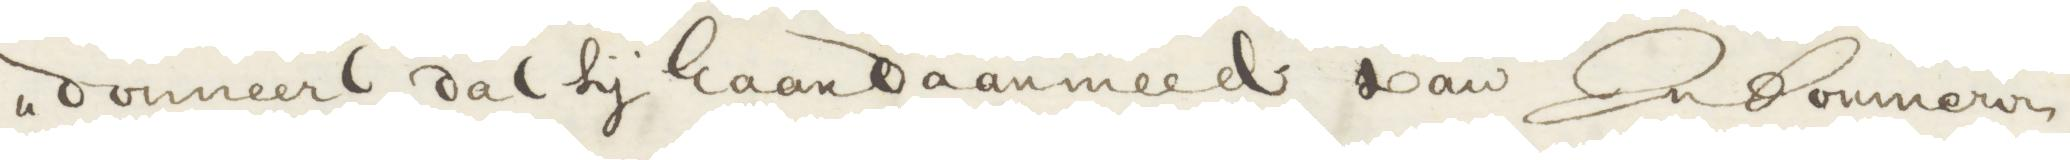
„donneert dat sij haar daarmeede van Jnformeren
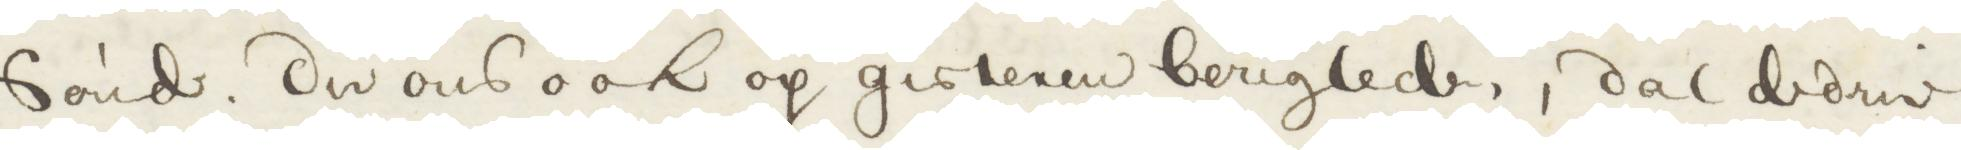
soude, die ons ook op gisteren berigteden, dat de drie
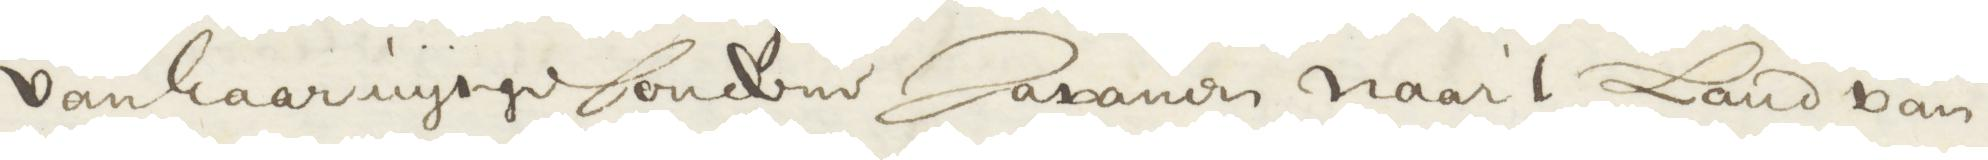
van haar uijt gesondene Javanen naar ’t Land van
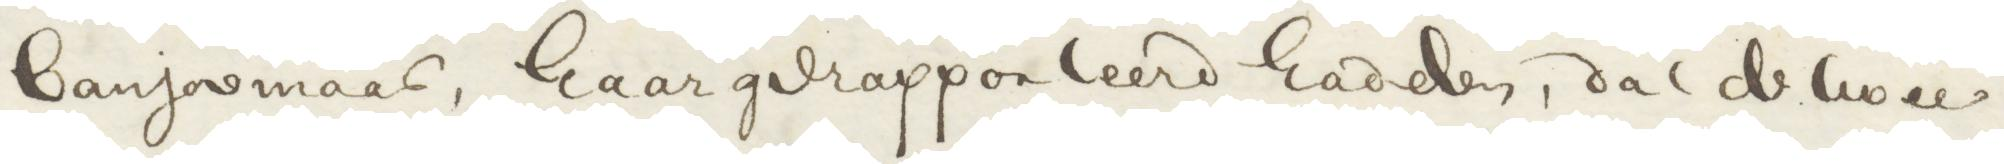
banjoemaas, haar gerapporteerd hadden, dat de twee
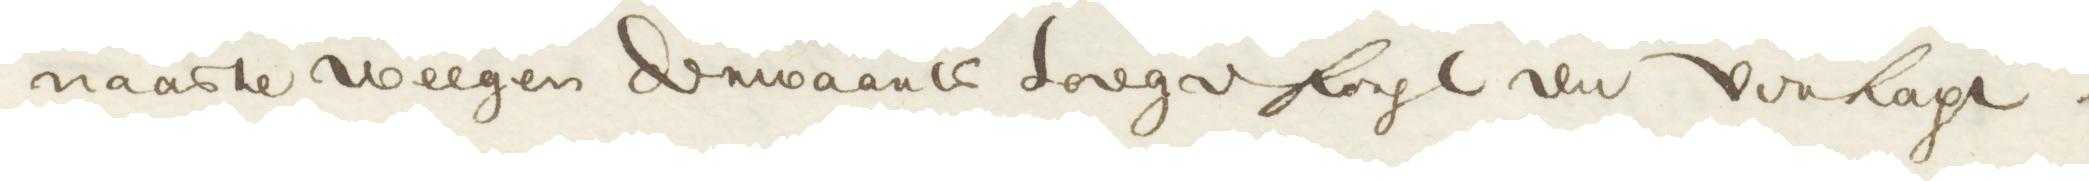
naaste weegen derwaarts toegestopt en verkapt
